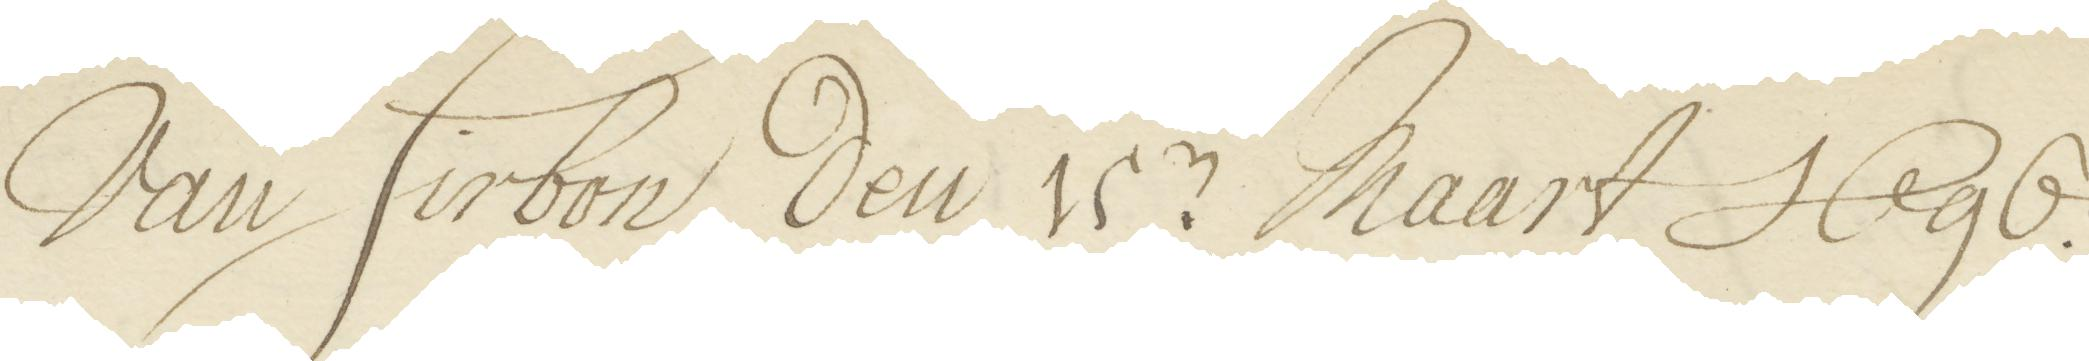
Van Sirbon den 15.en Maart 1696.
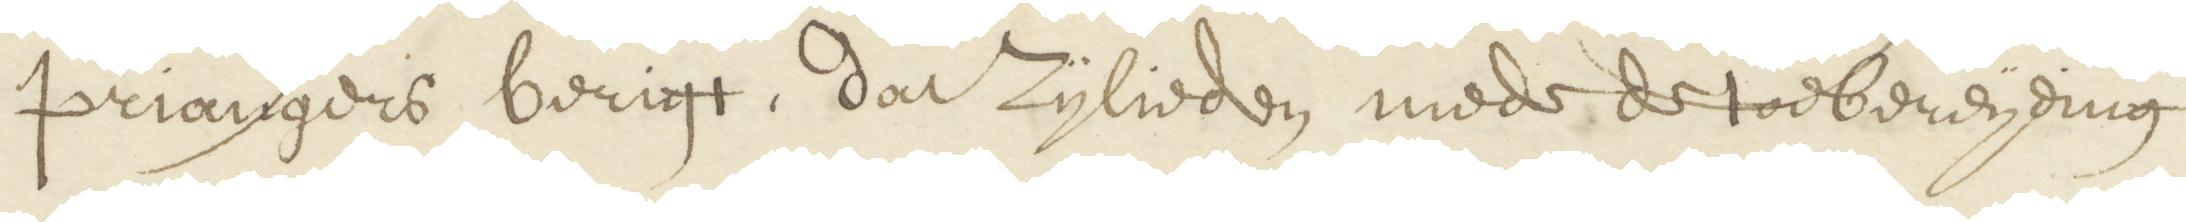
priangers berigt, dat zijlieden mede de toebereijding
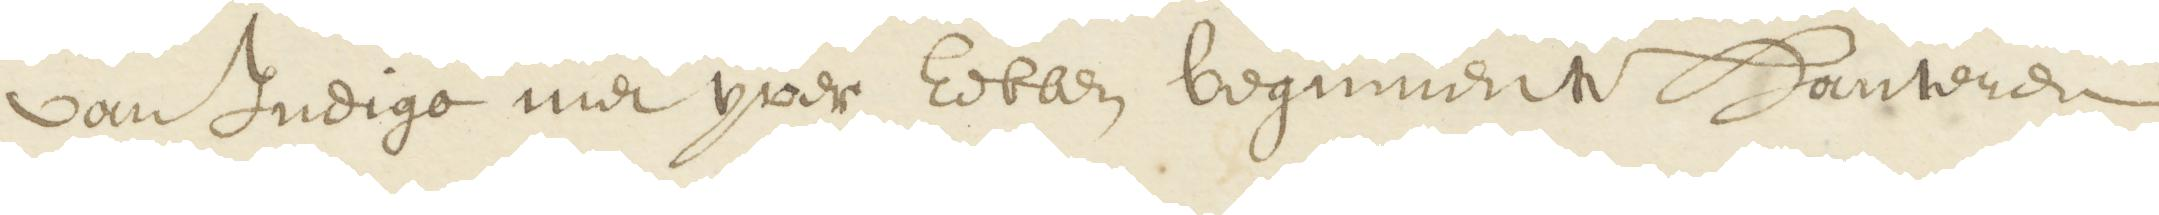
van Indigo met ijver hebben beginnen te Hanteren.
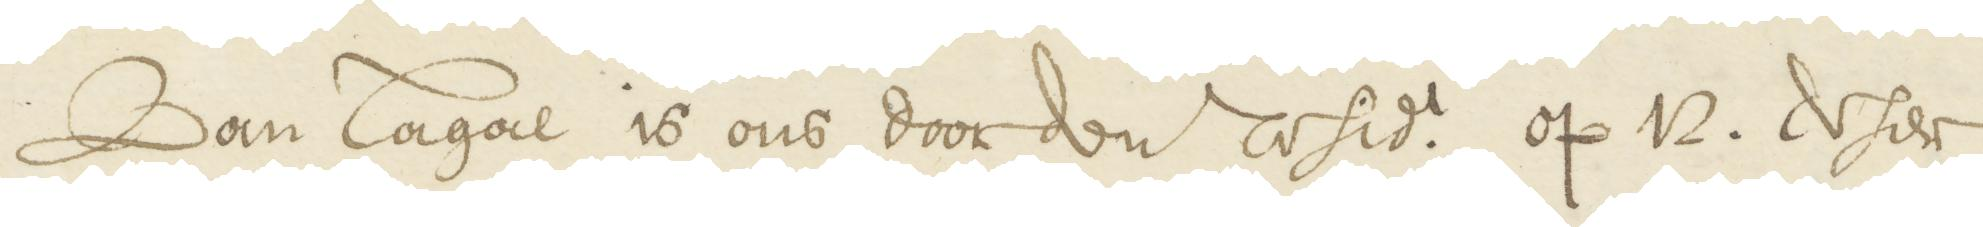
Van Tagal is ons door den resid.t op 12. deser
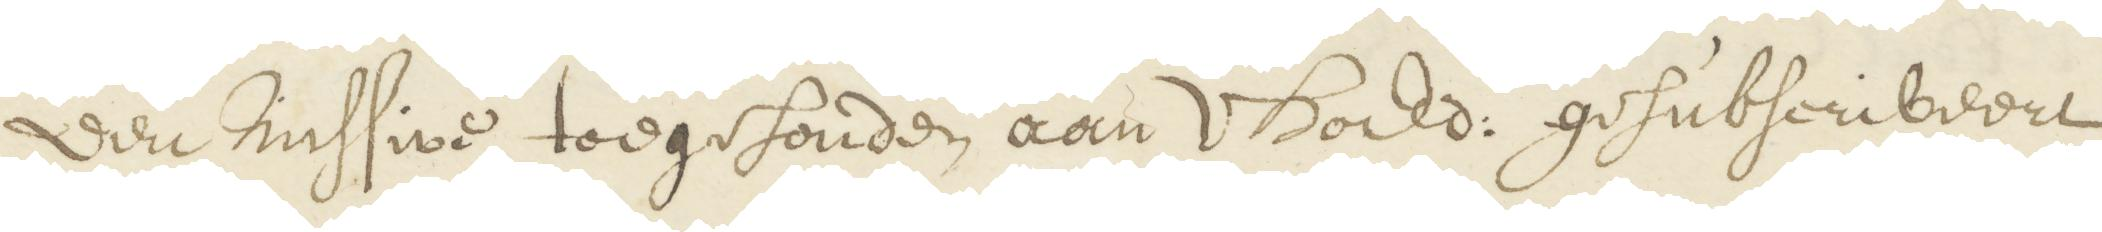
een missive toegesonden aan VHoEd: gesubscribeert,
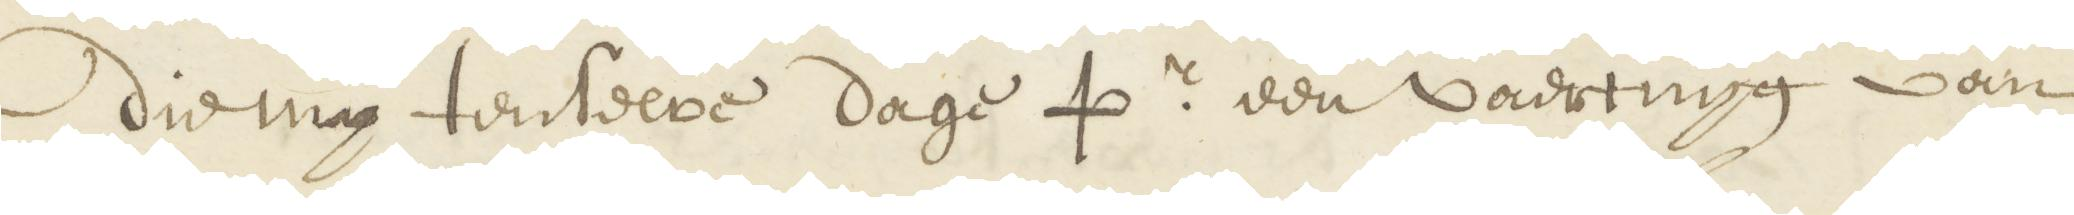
die mij tenselve dage p:r een vaertuijg van
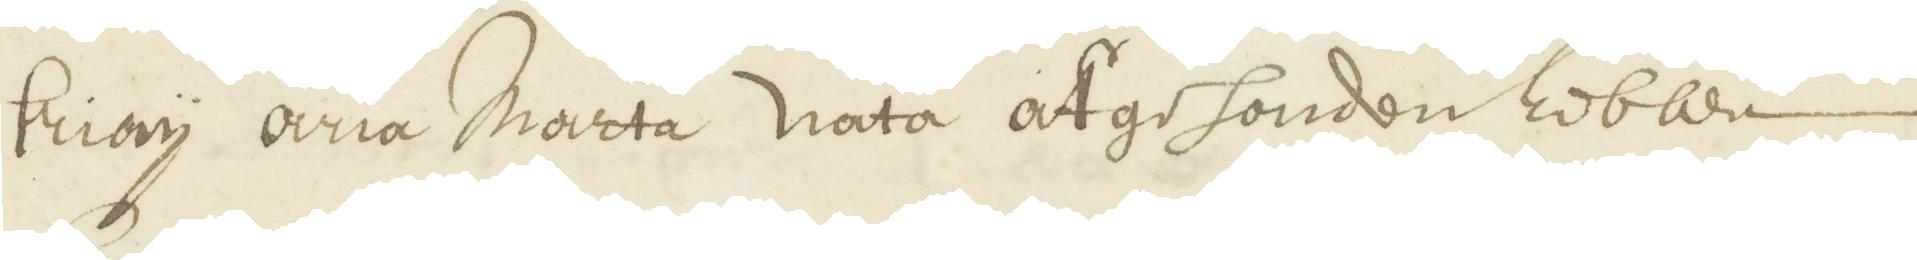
kiaij aria Marta nata afgesonden hebben.
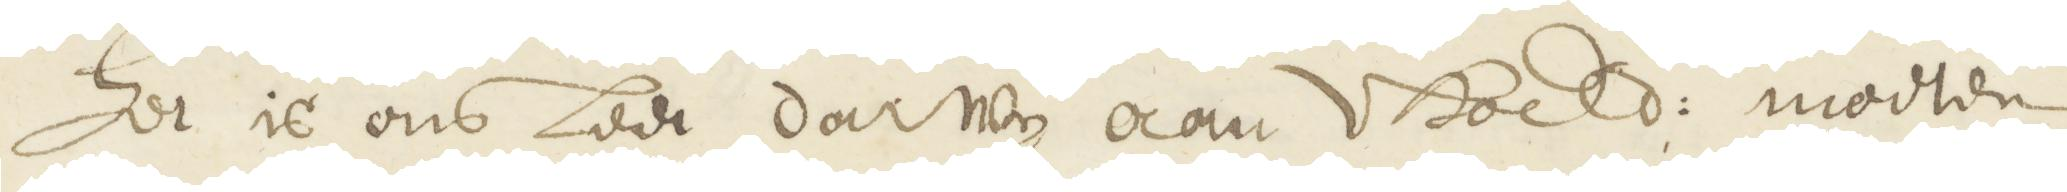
Het is ons leet dat wij aan VHoEd: moeten
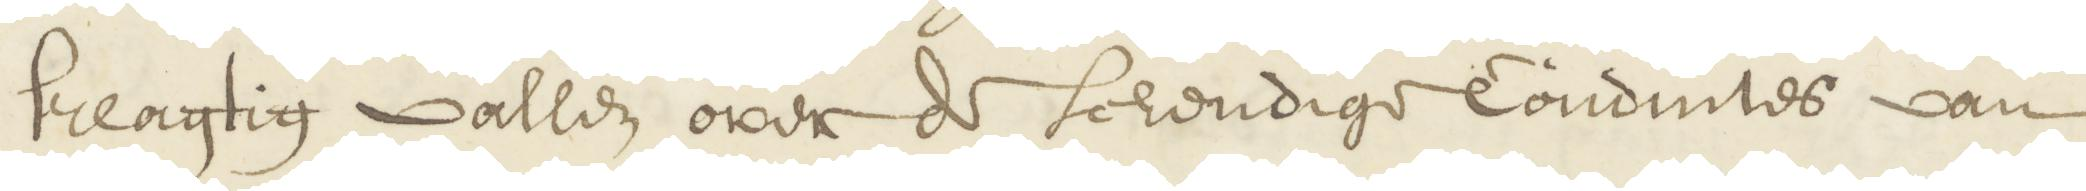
klagtig vallen over de schendige Conduites van
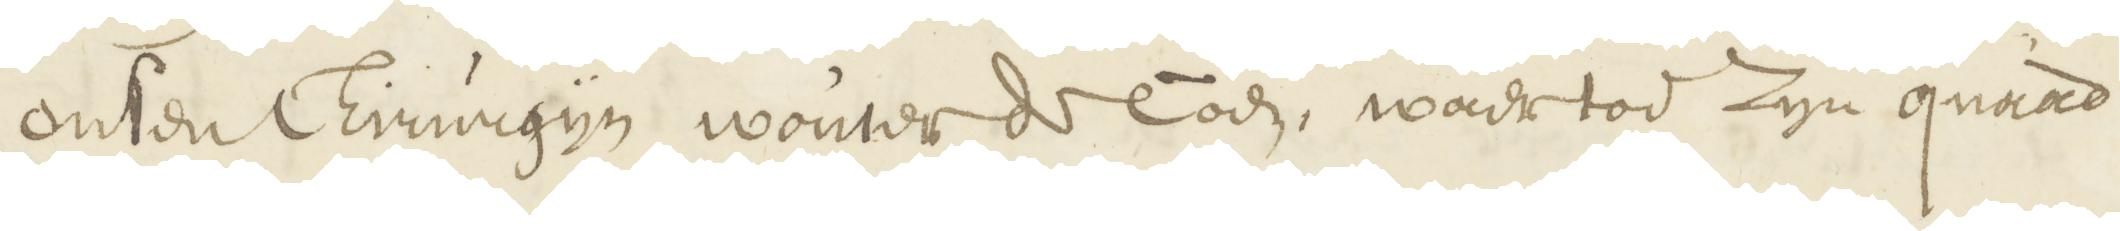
onsen Chirurgijn wouter de Coen, waer toe zijn quaad
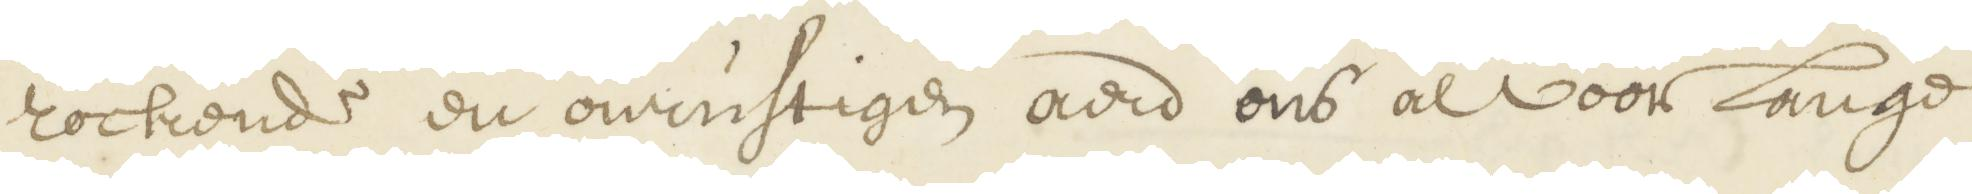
rockende en onrustigen aerd ons alvoorlange
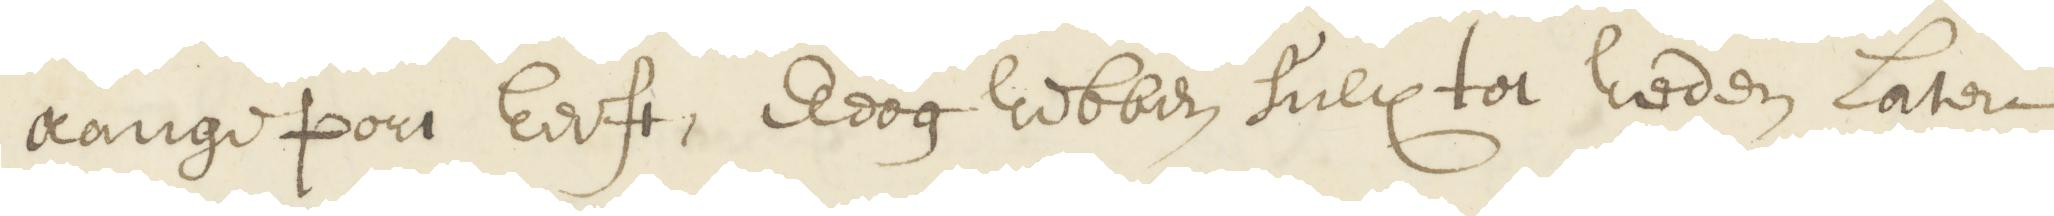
aangeport heeft, Edog hebben sulx tot heden laten
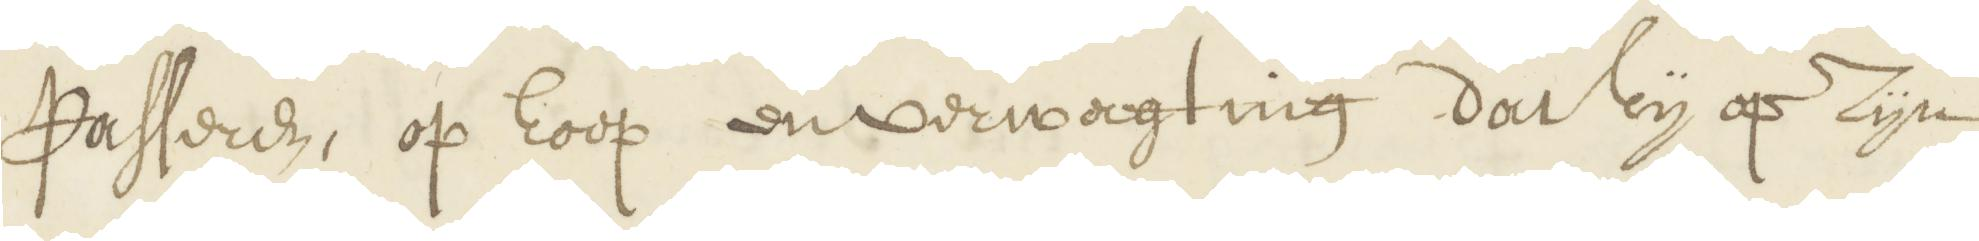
Passeren, op hoop enverwagting dat hij op zijn
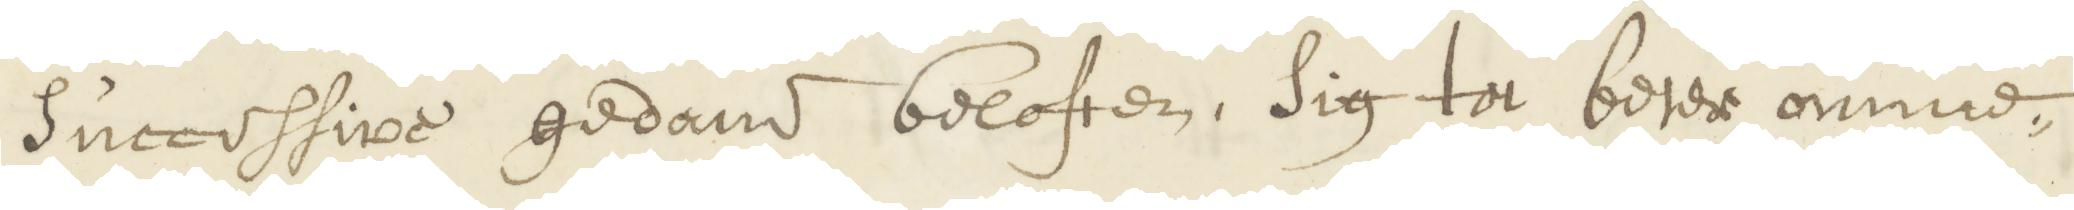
successive gedane beloften, sig tot beter omme„
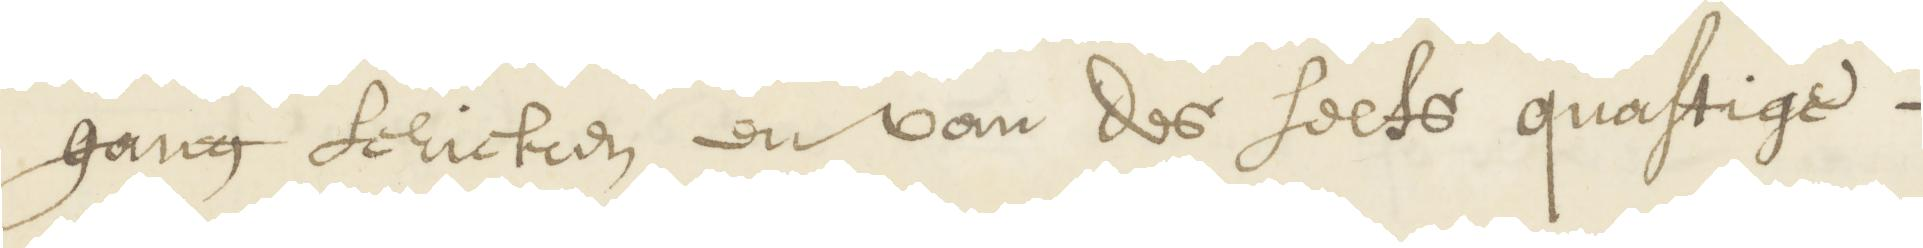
gang schicken en van des selfs quastige
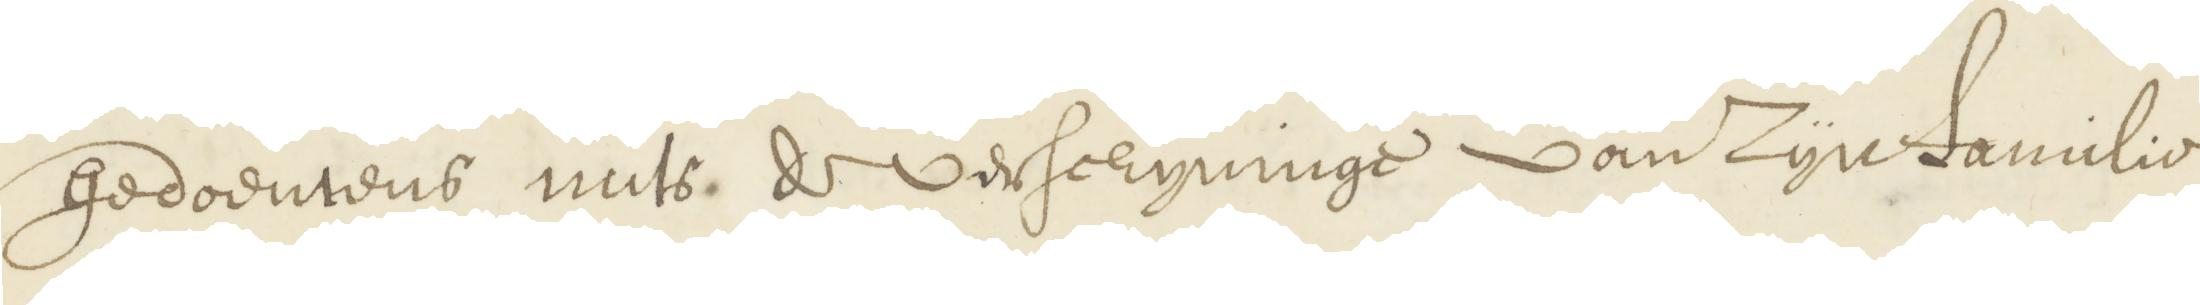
gedoentens mits de verschijninge van zijn familie
